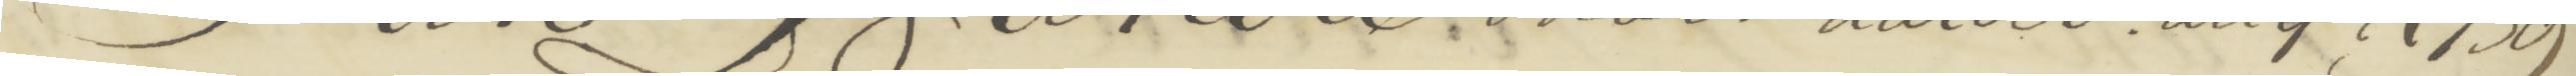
Van Banda onder dato 30:' aug:' 1739
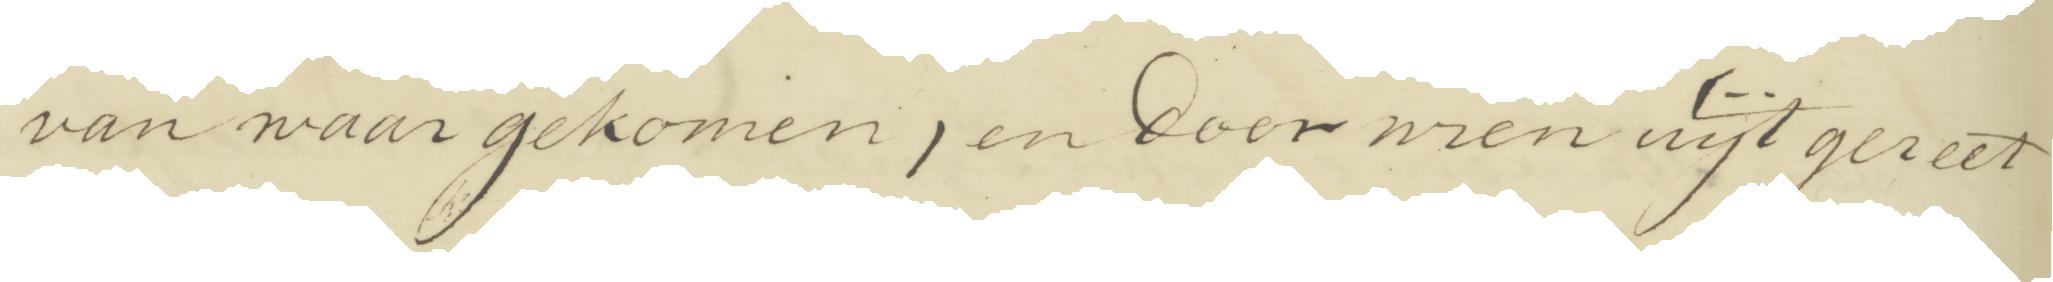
van waar gekomen, en door wien uijt gereet
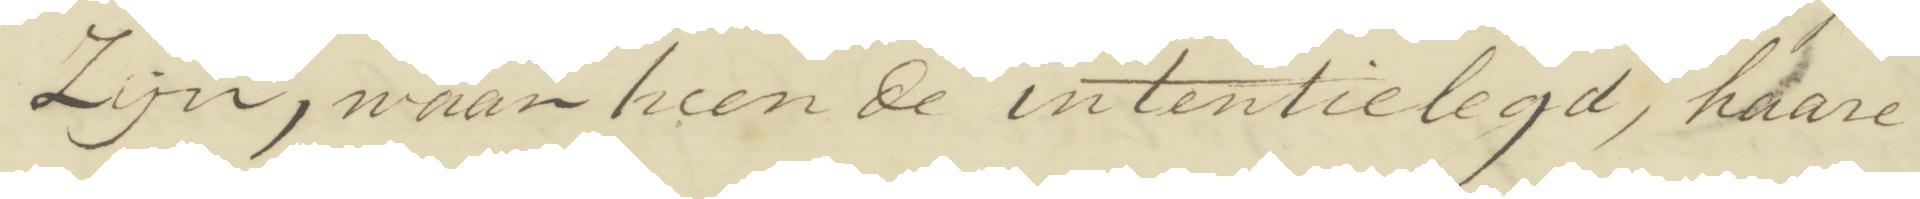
zijn, waar heen de intentie legd, haare
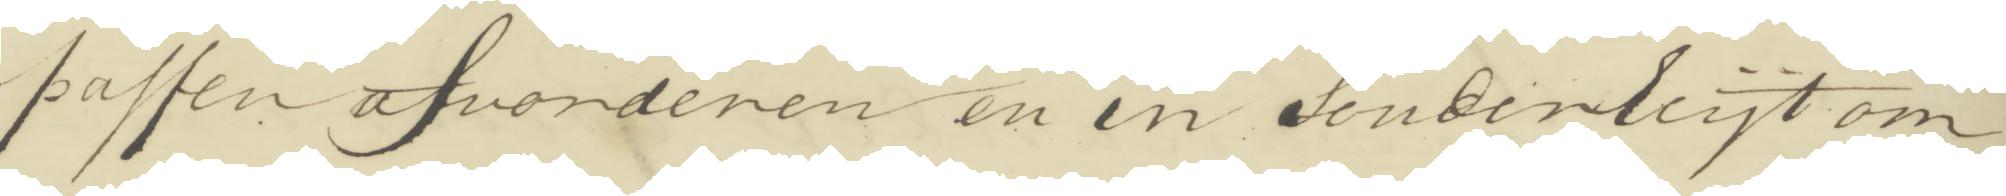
passen afvorderen en in sonderheijt om
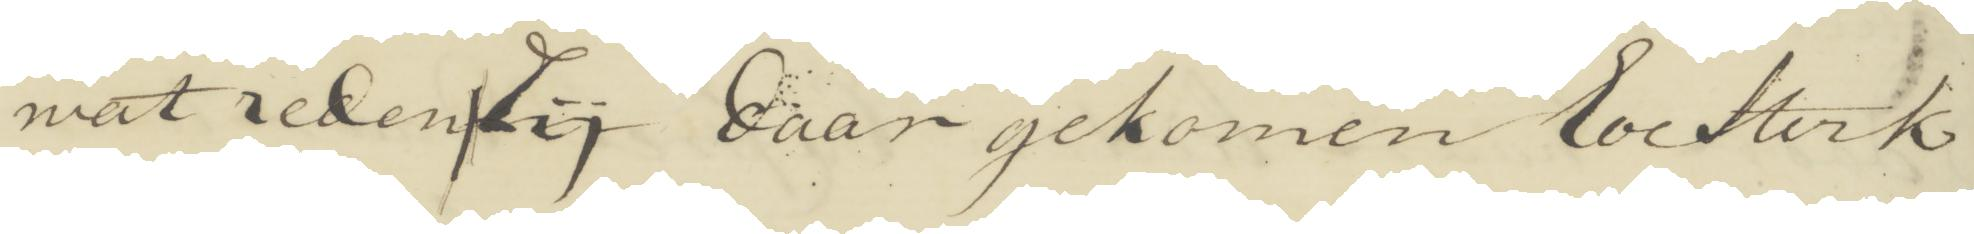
wat reden, zij daar gekomen hoe sterk
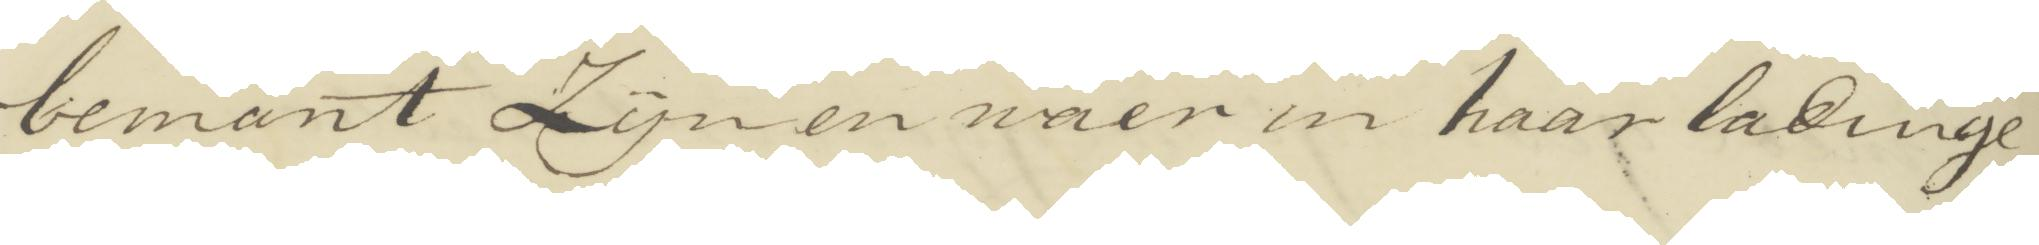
bemant zijn en waer in haar ladinge
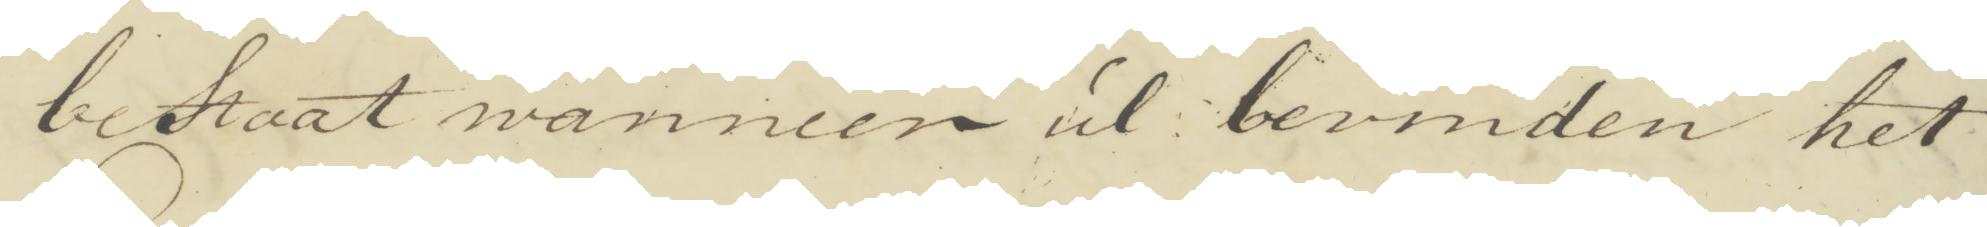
bestaat wanneer ul: bevinden het
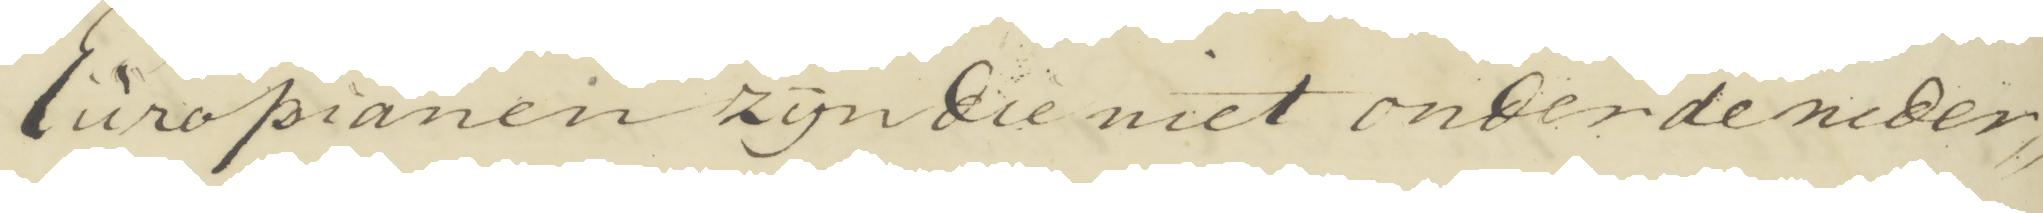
Europianen zijn die niet onder de neder„
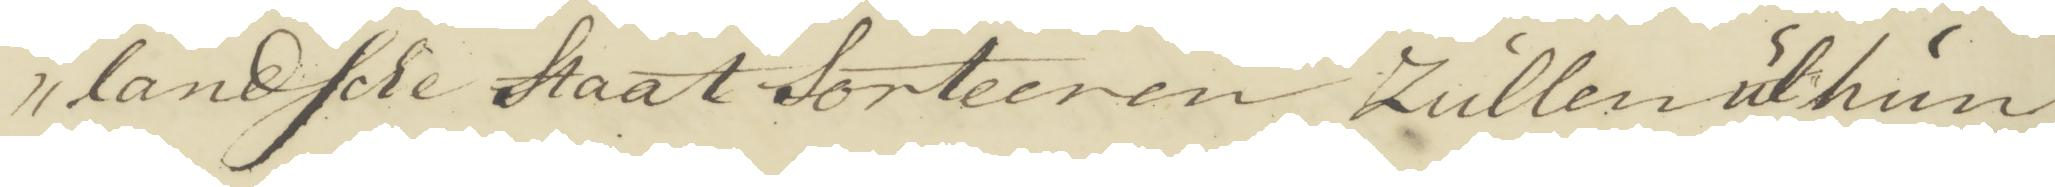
„landsche staat sorteeren zullen ul„ hun
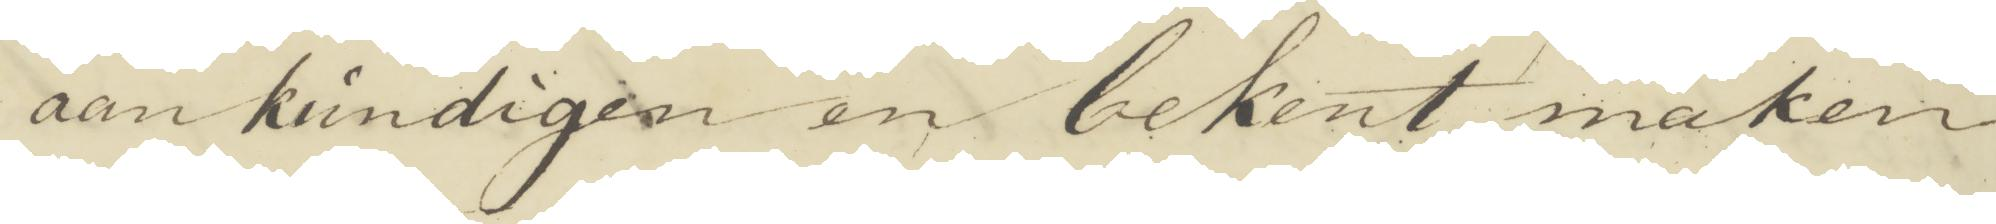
aan kundigen en bekent maken
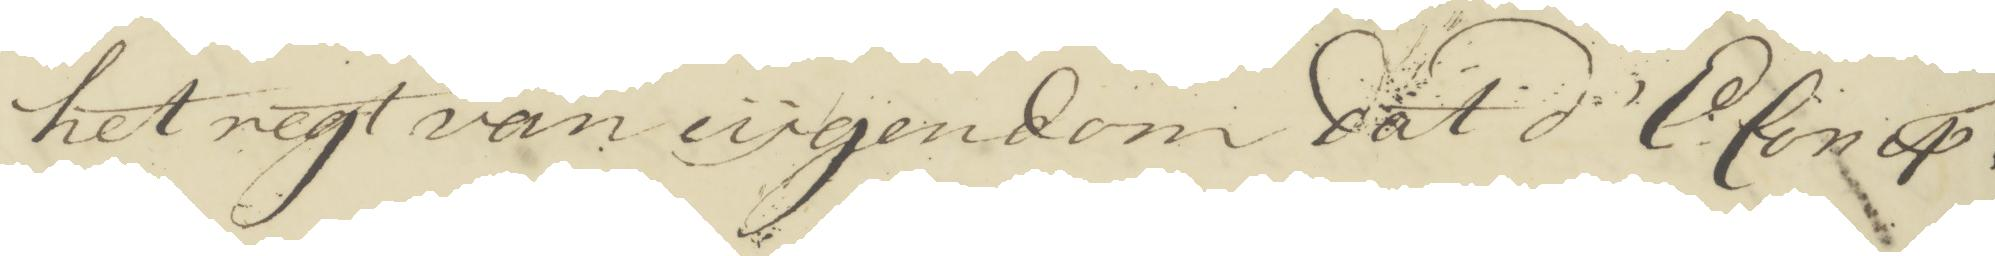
het regt van eijgendom dat d’E Comp
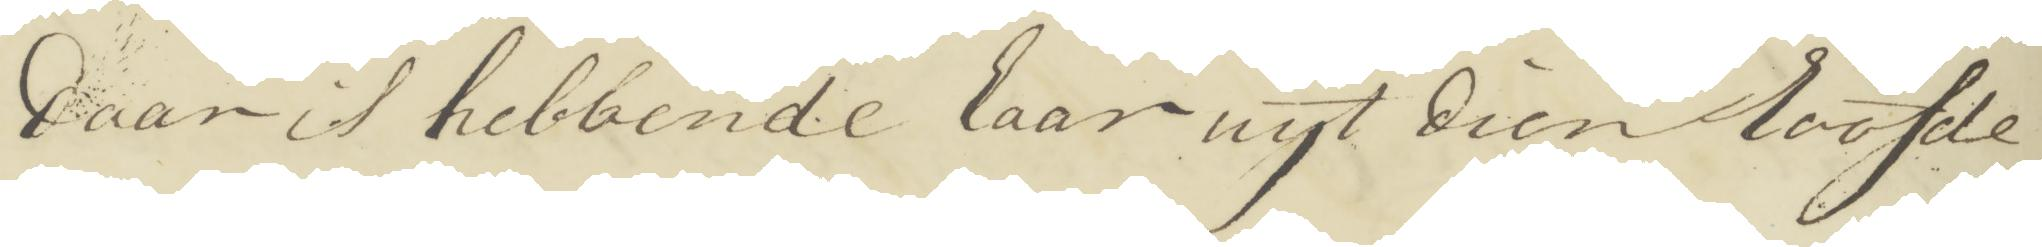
daar is hebbende haar uijt dien hoofde
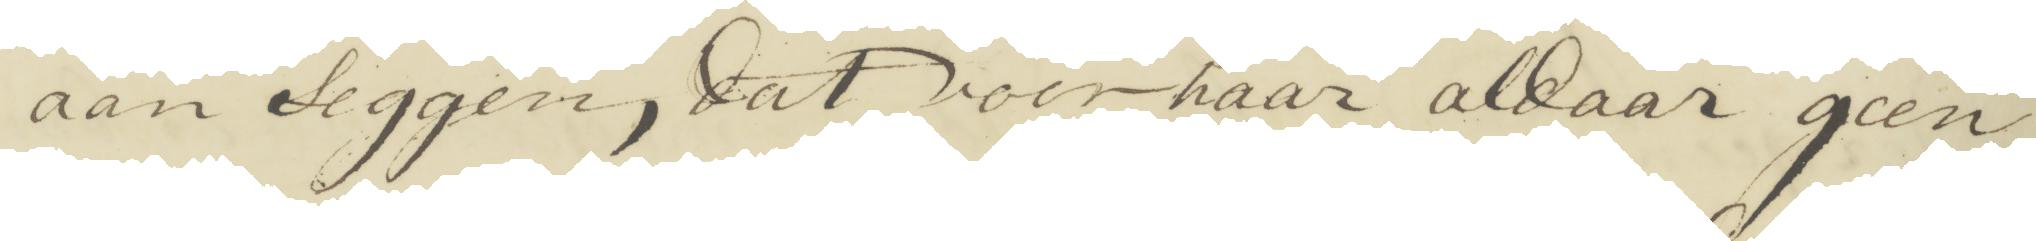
aan seggen, dat voor haar aldaar geen
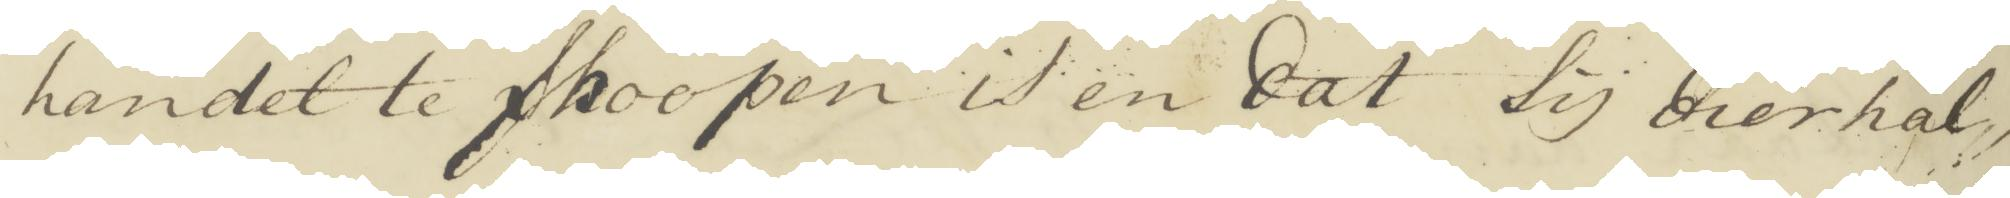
handel te verhoopen is en dat sij dierhal„
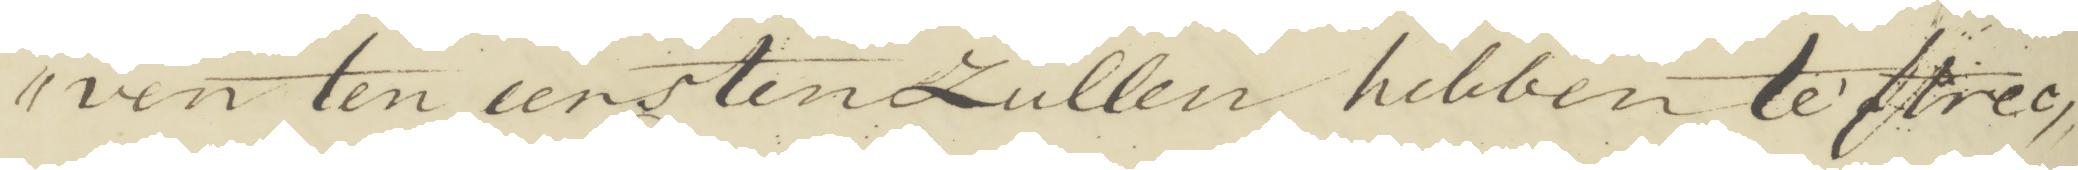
„ven ten eersten zullen hebben te vertrec„
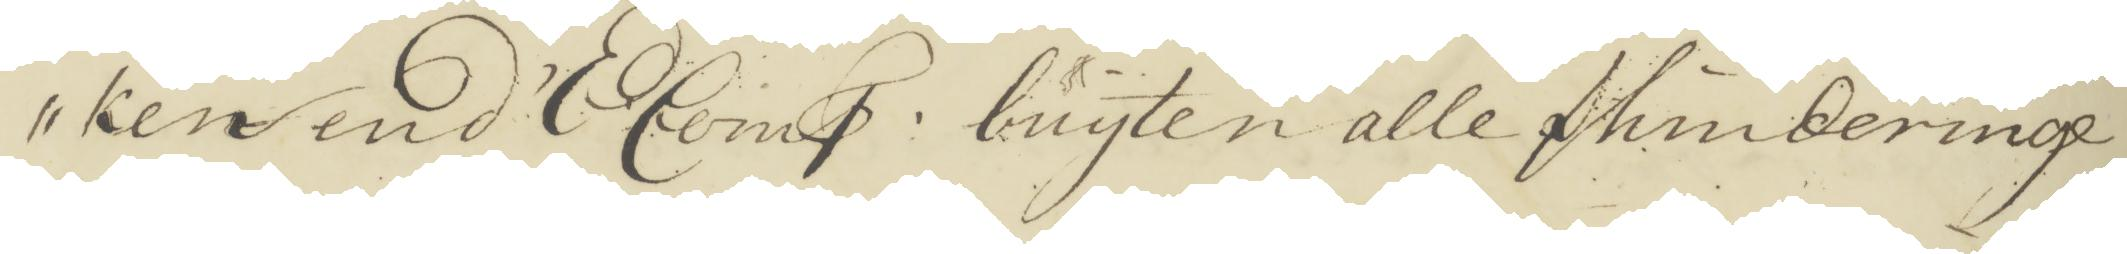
„ken end’E Comp: buijten alle verhinderinge
